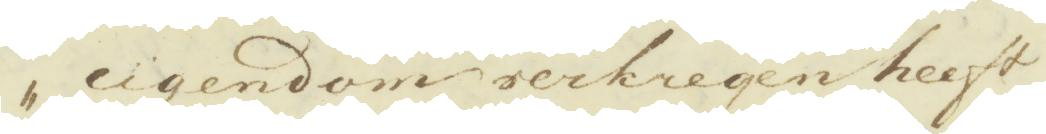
„ eigendom verkregen heeft
